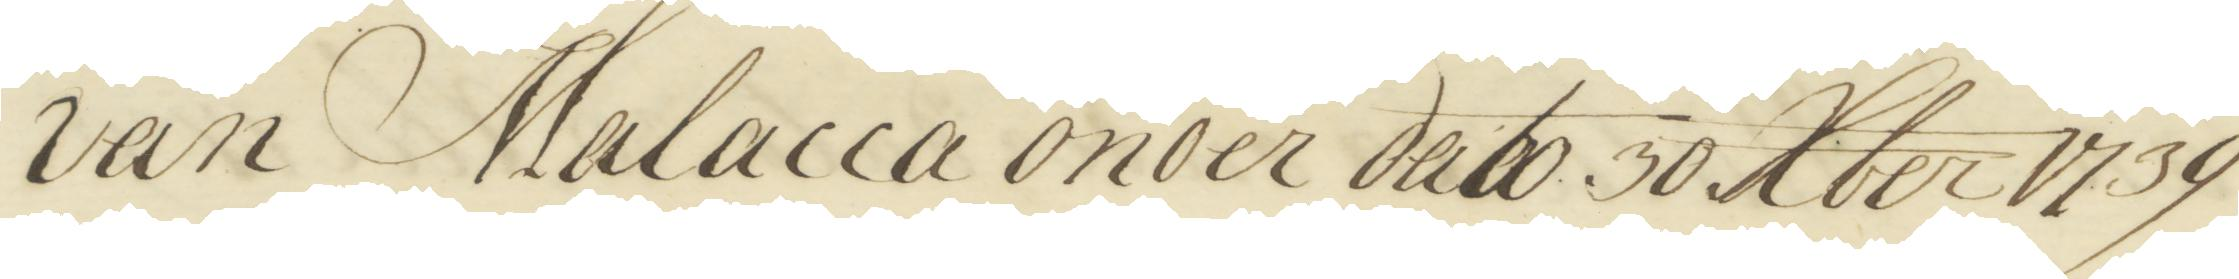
van Malacca onder dato 30 Xber 1739
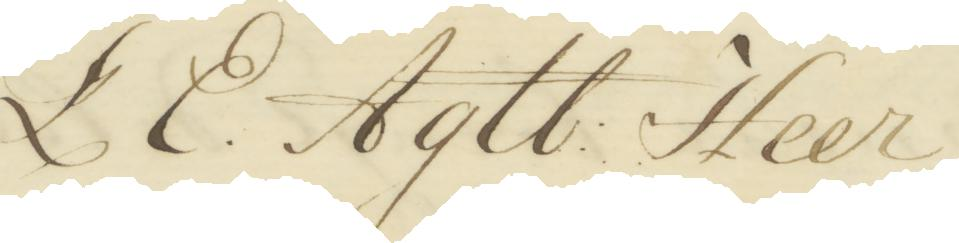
E E. Agtb: Heer
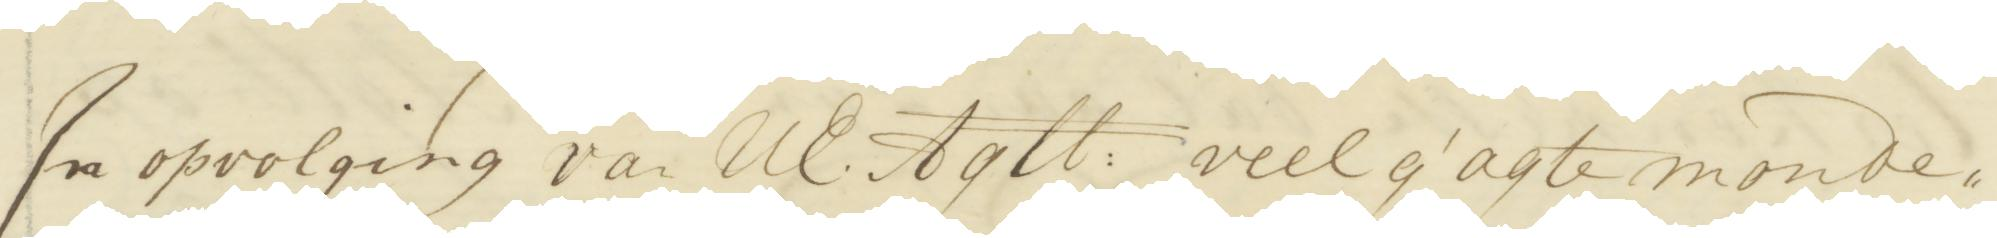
In opvolging van UE: Agtb: veel g’agte monde„
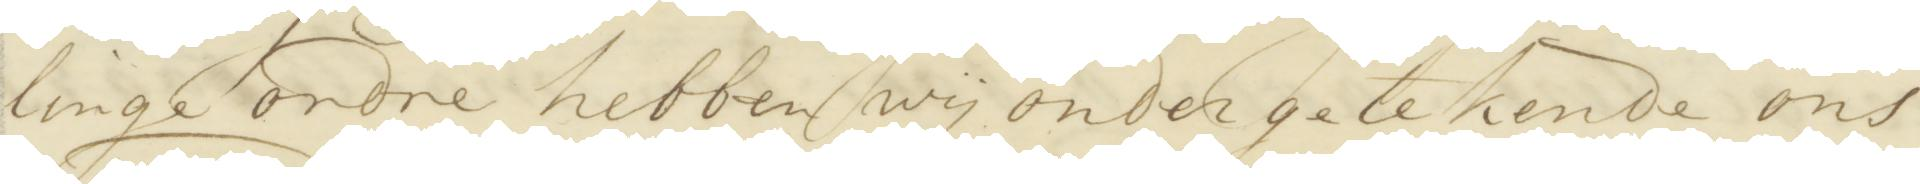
linge ordre hebben wij ondergetekende ons
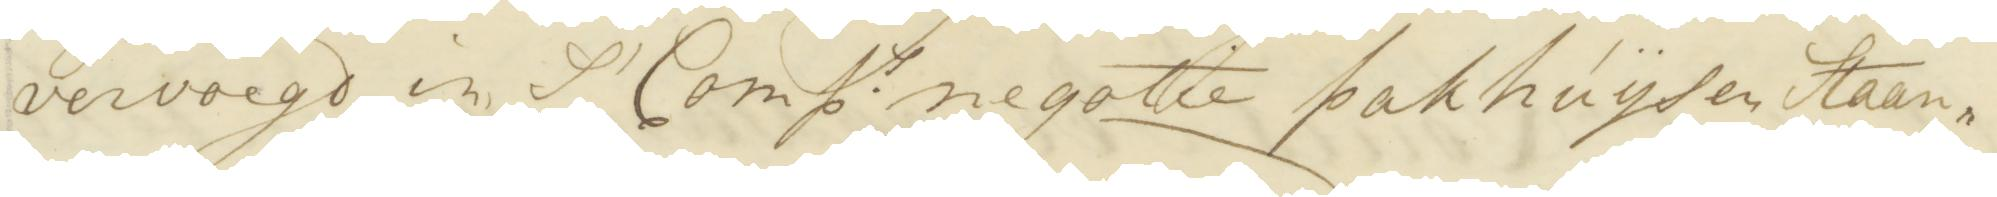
vervoegd in S' Comp:s negotie pakhuijsen staan„
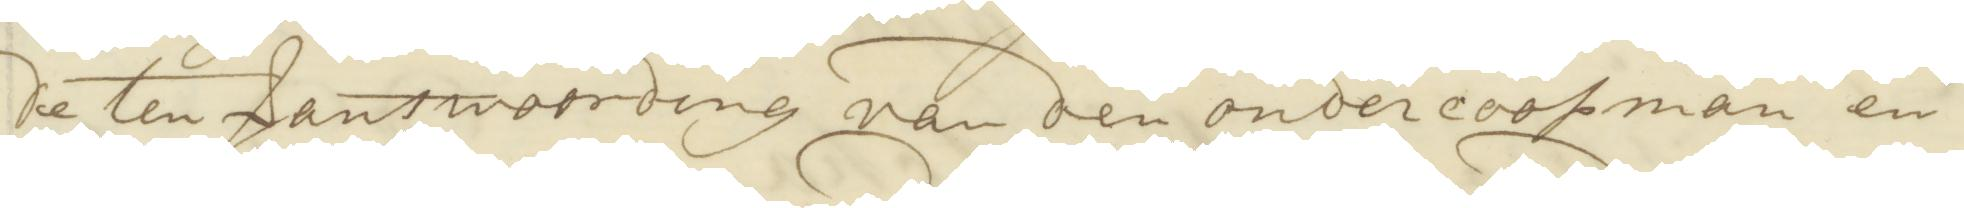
de ten verantwoording van den ondercoopman en
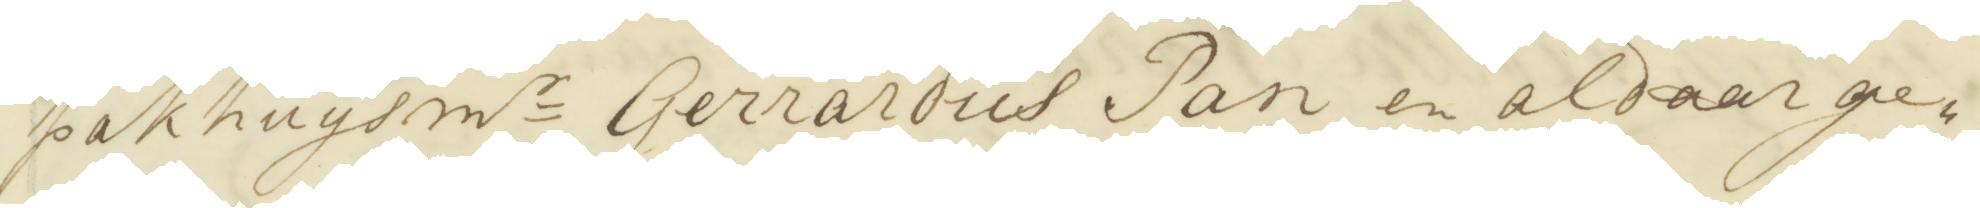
pakhuijsm=r Gerrardus Pan en aldaar ge„
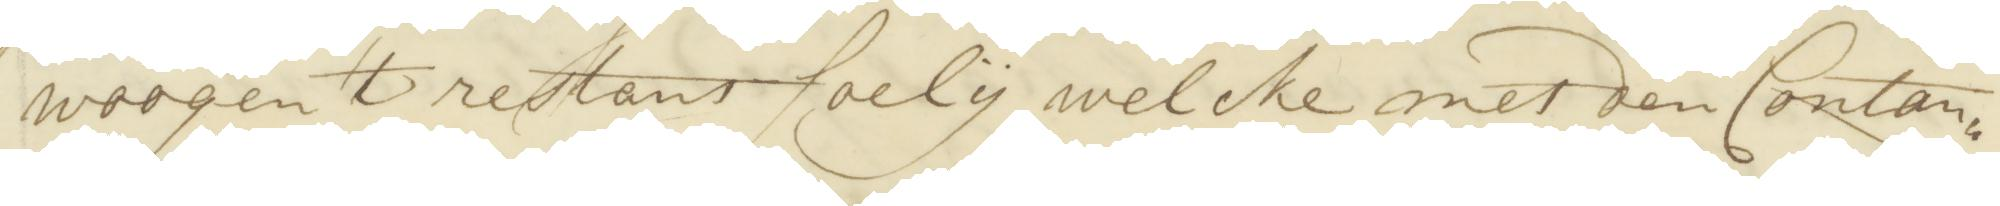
woogen 't restant foelij welcke met den contan„
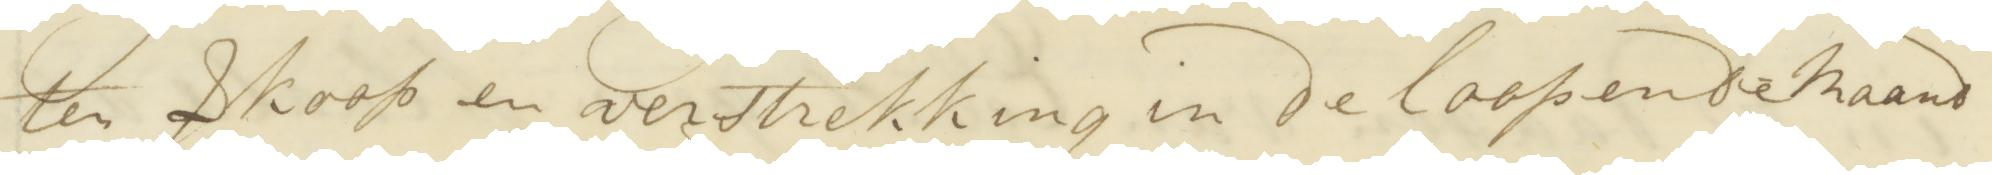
ten verkoop en verstrekking in de loopende Maand
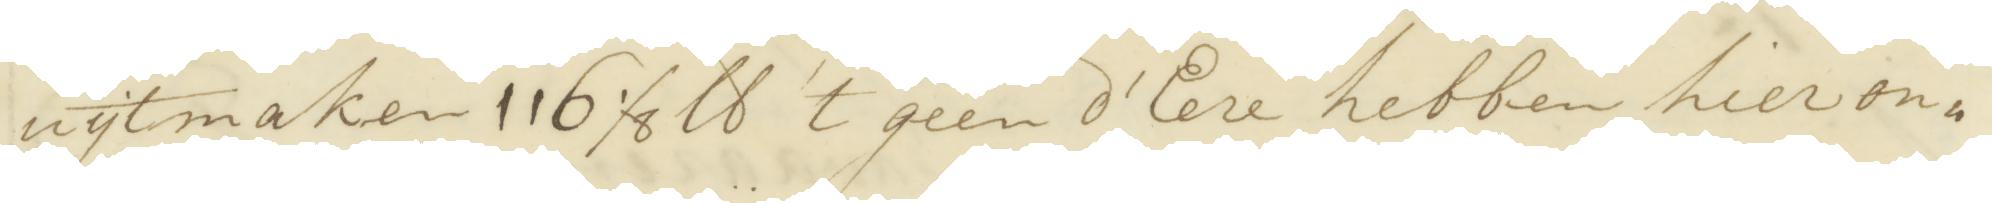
uijtmaken 116 1/8 lb ’t geen d'Eere hebben hieron„
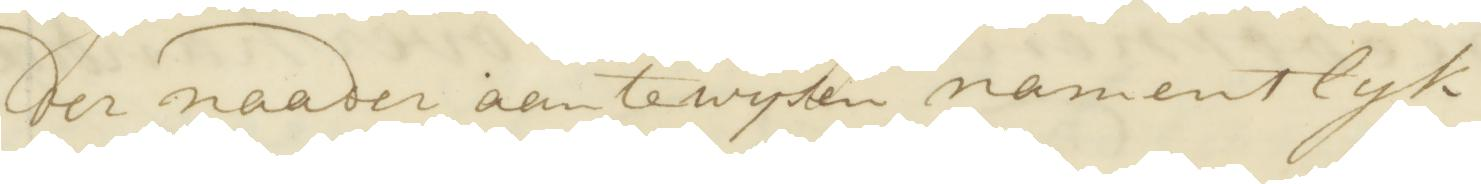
der naader aan te wijsen namentlyk
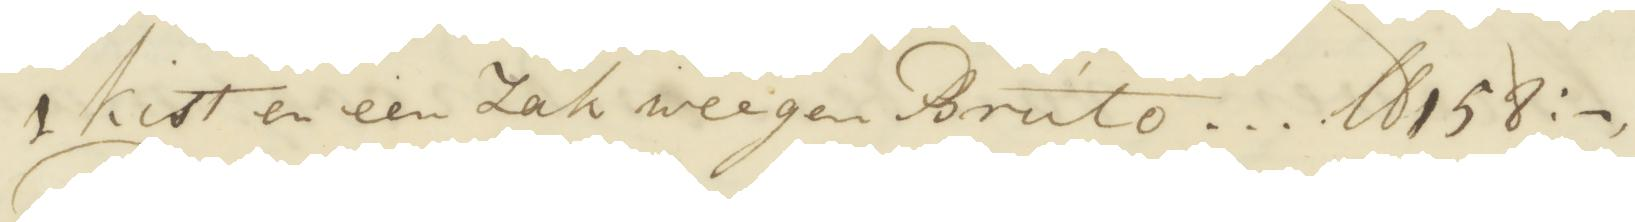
1 kist en een zak weegen Bruto - - - - lb 158:-,
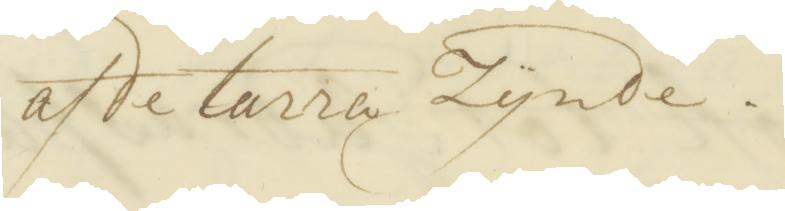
af de tarre zijnde -
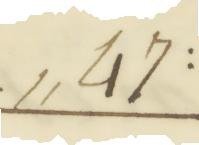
„ 47
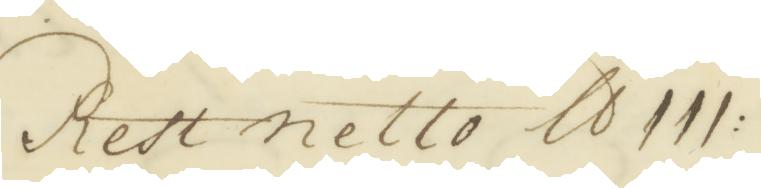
Rest netto lb 111:
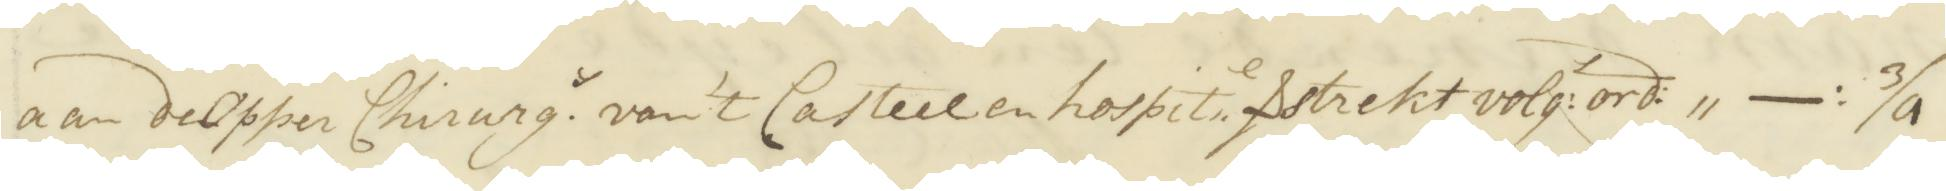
aan de Opper Chirurg.s van ’t Casteel en hospit„e verstrekt volg:s ord „—: ¾
